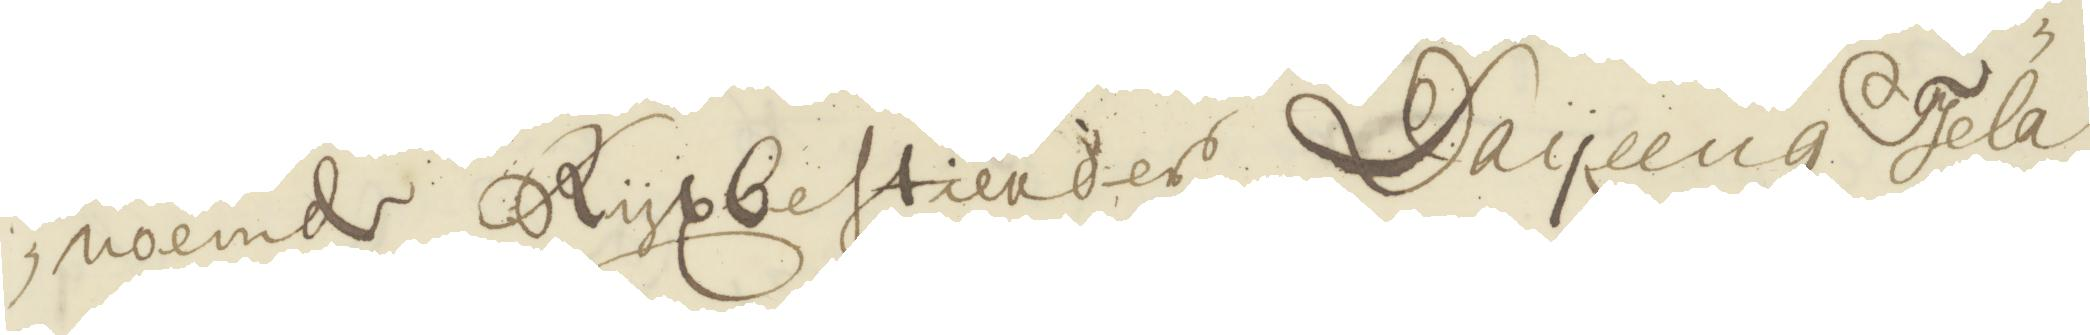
„noemde Rijxbestierder Daijeeng Tjela
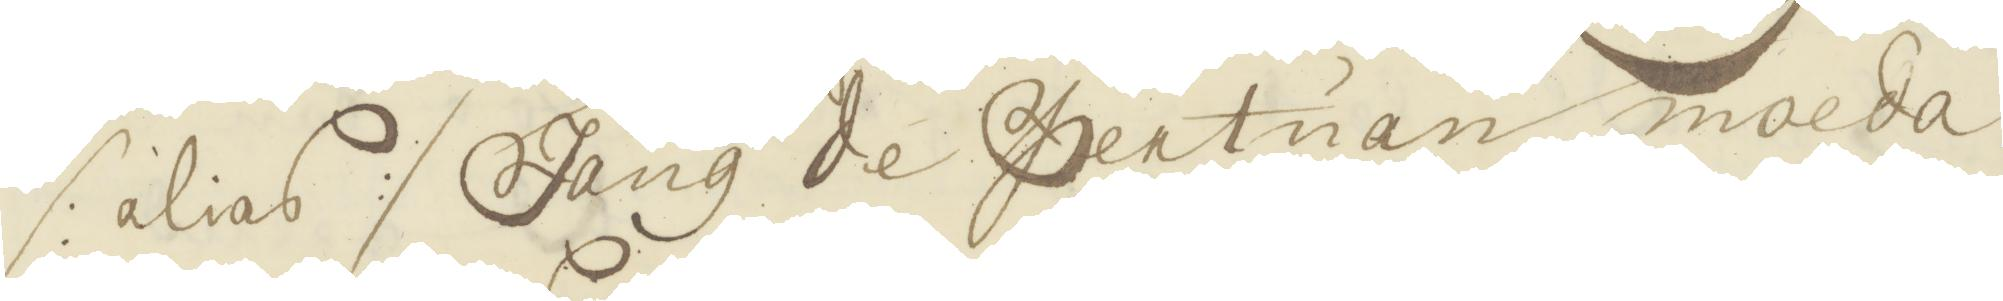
/:alias :/ Jang de pertuan moeda
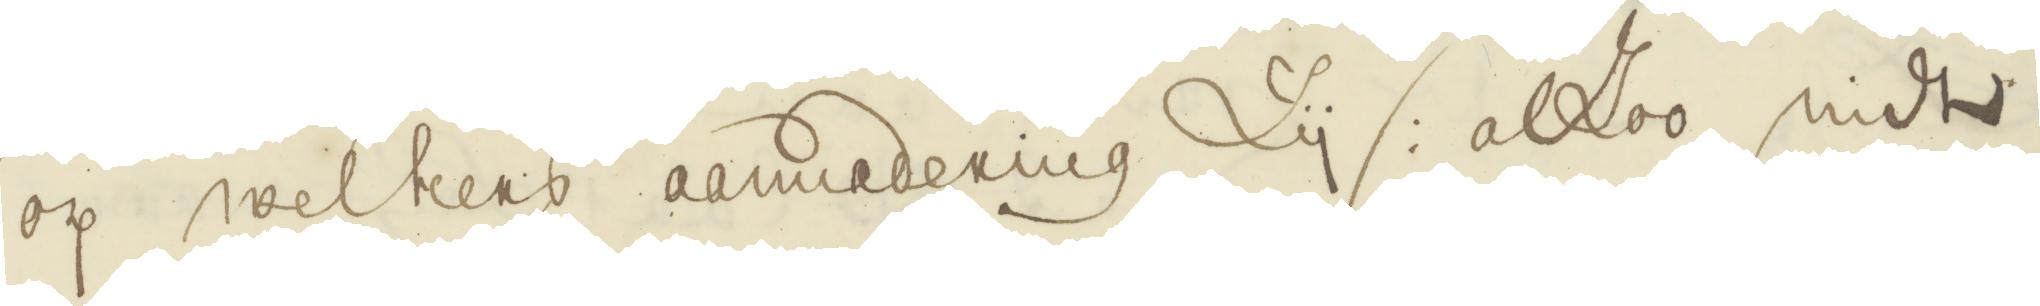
op welkers aannadering Zij /:alzoo niet
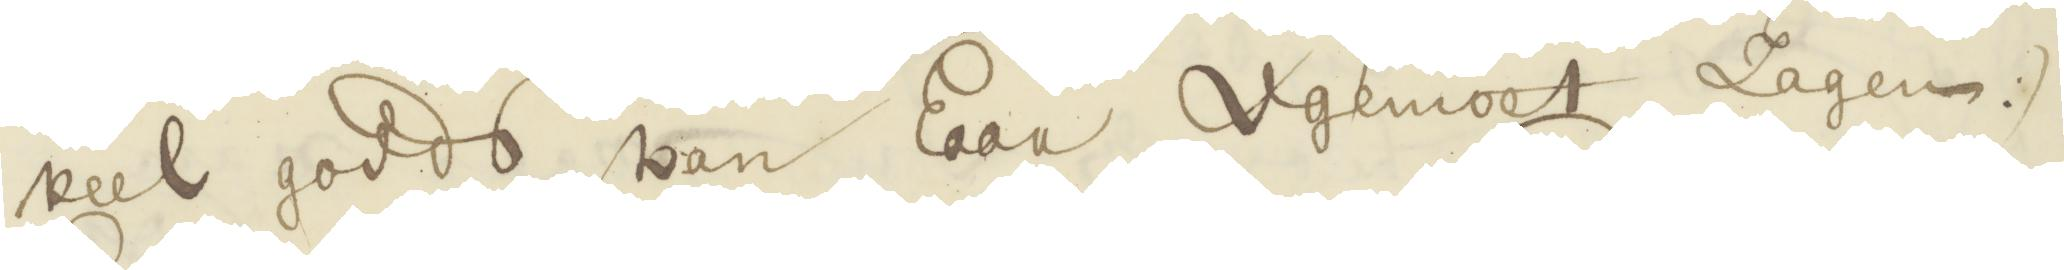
veel goeds van haar tegemoet Zagen:)
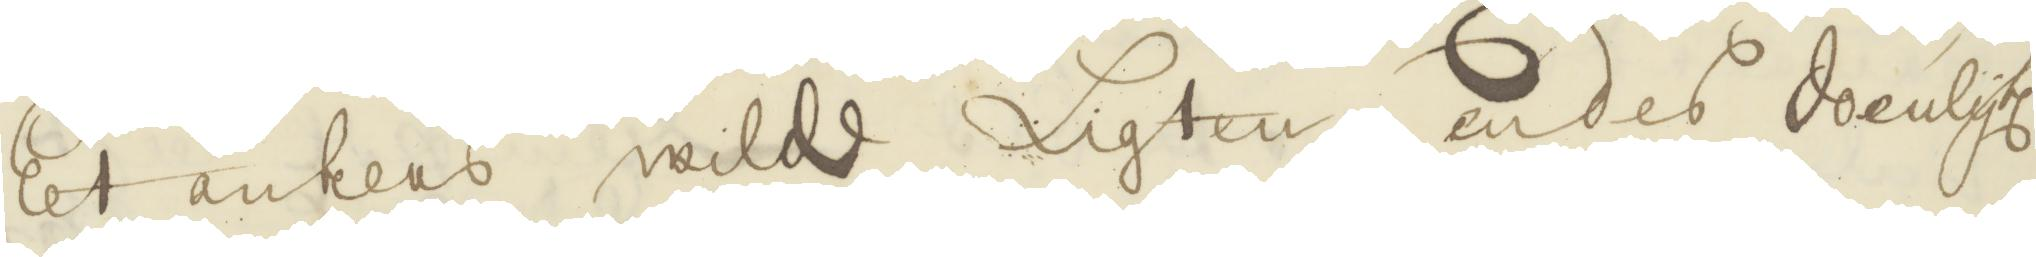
het ankers wilde Ligten en des doenlijk
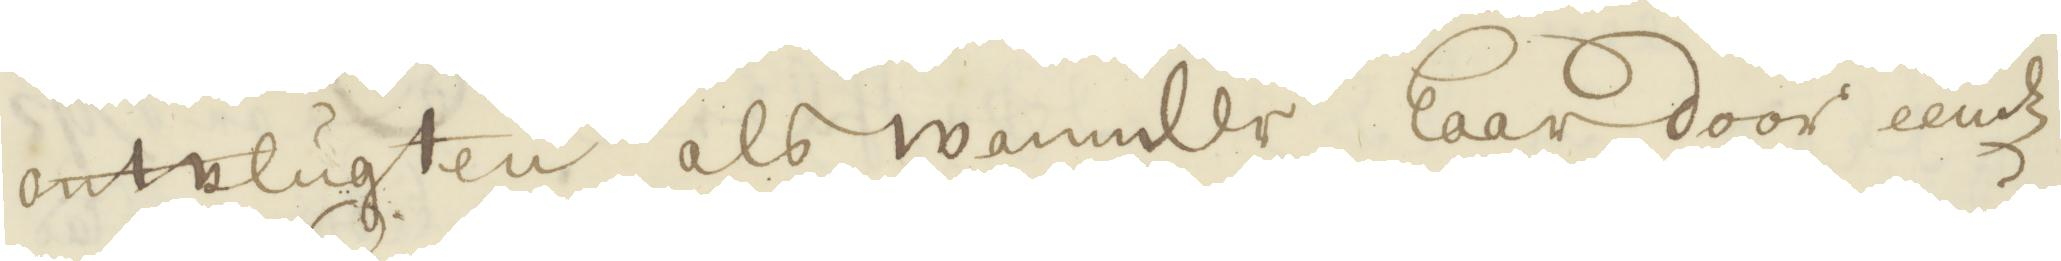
ontvlugten als wanneer haar door eenen
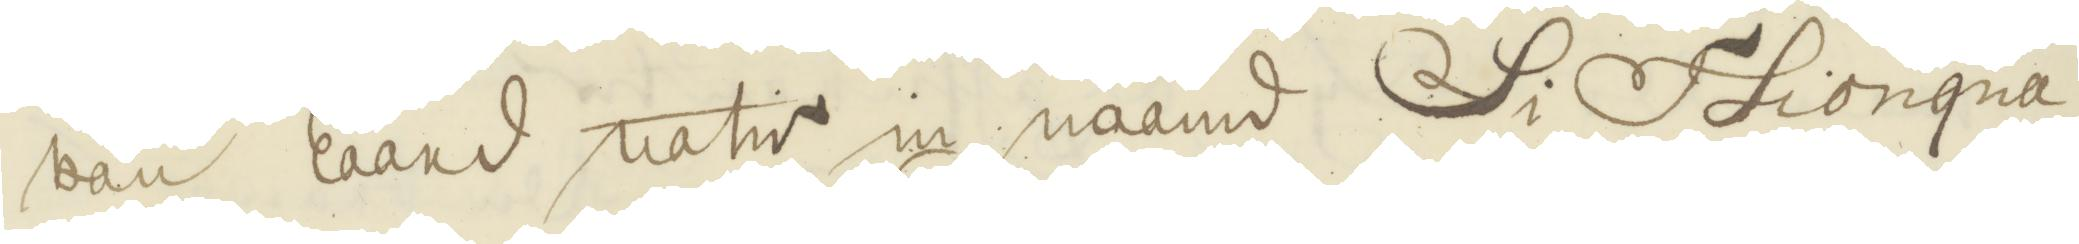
van haare natie in naame Si T Sionqua
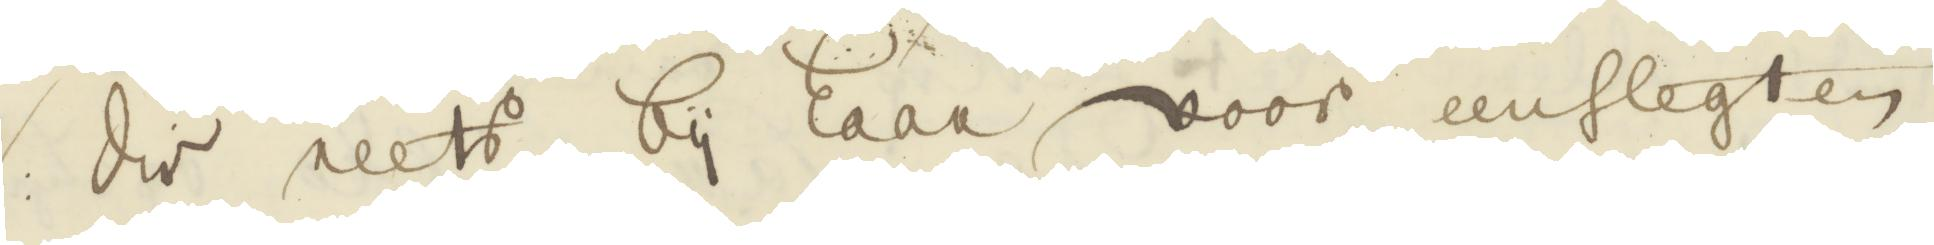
/:die reets bij haar voor een slegten
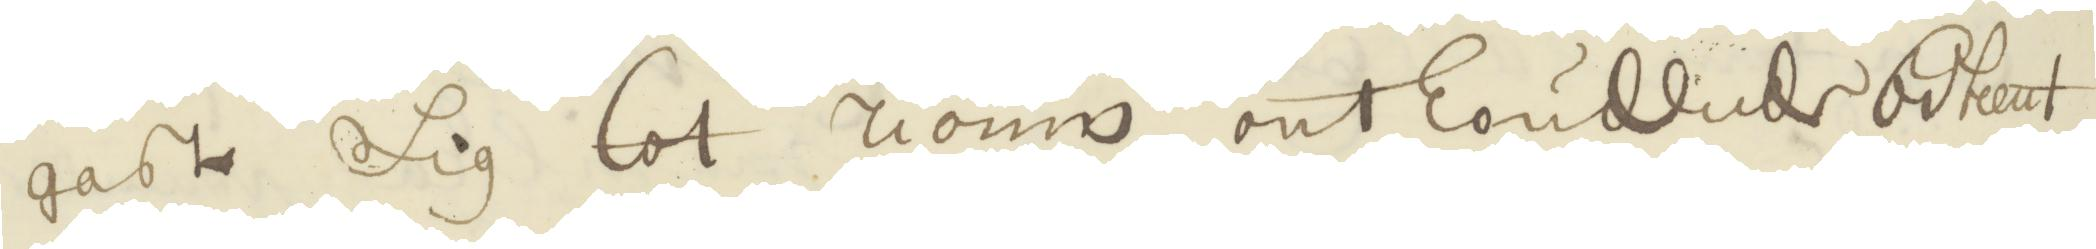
gast Sig tot riouw onthoudende bekent
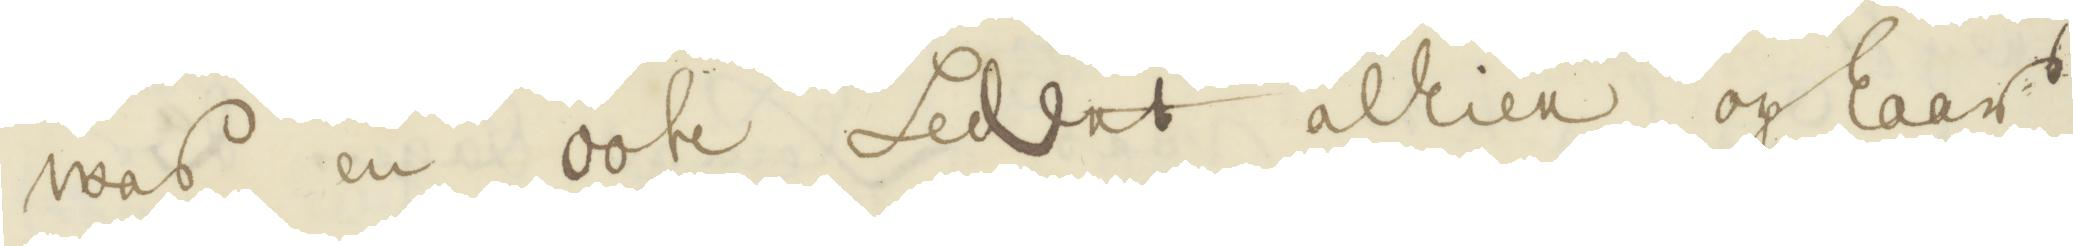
was en ook Sedert alhier op haar
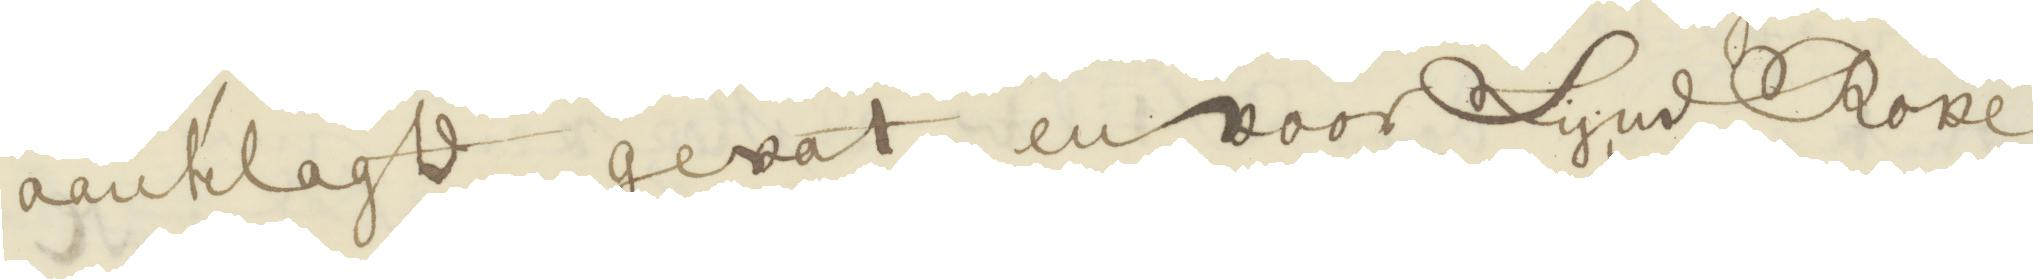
aanklagte gevat en voor Sijne Rove
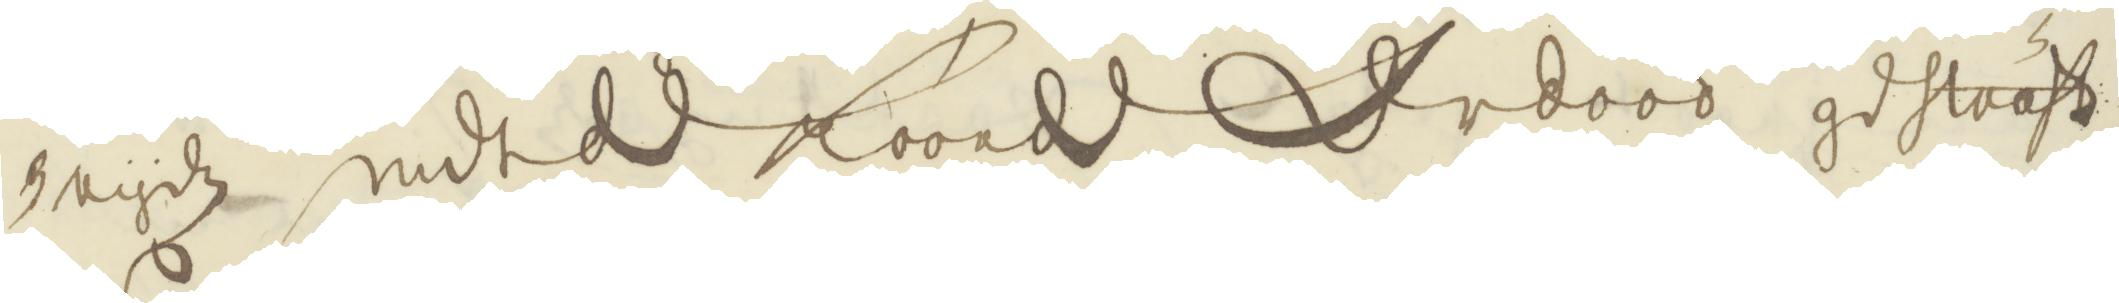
rijen met de koorde Terdood gestraft
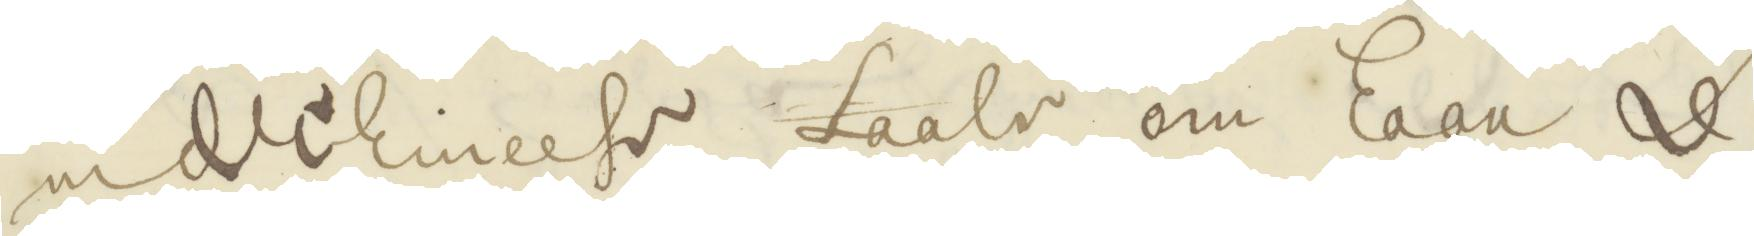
in de Chineese taale om haar te
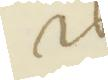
is :/
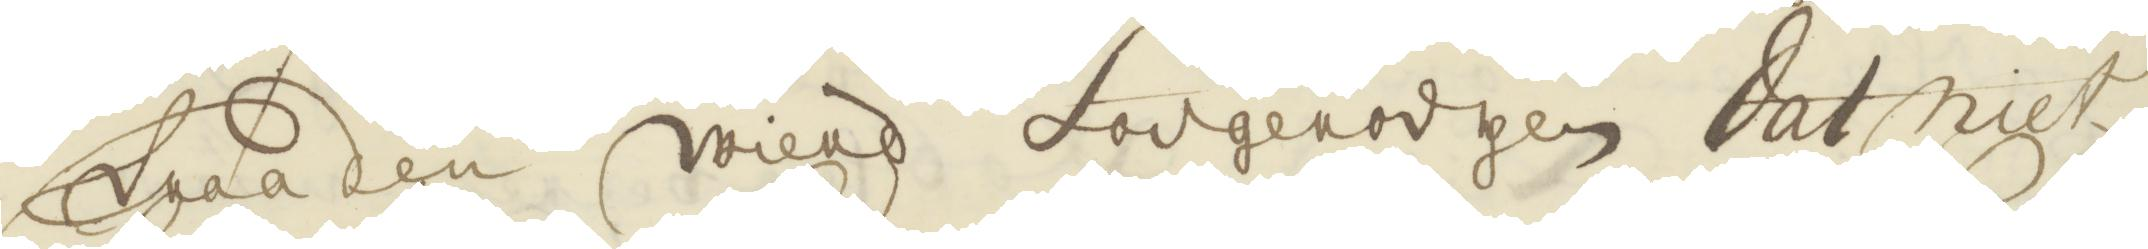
Verraaden wierd toegeroepen dat niet
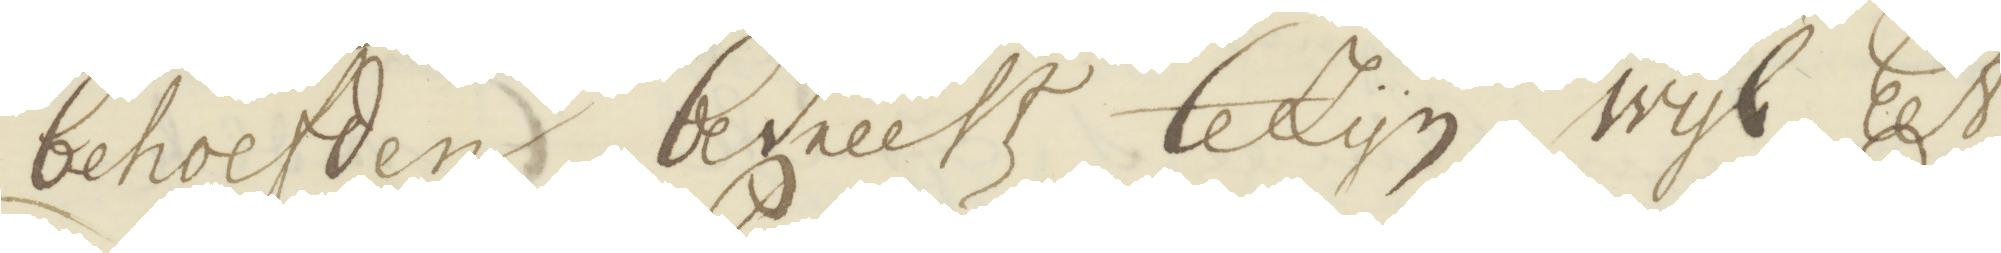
behoefdend bevreest te Zijn wijl het
